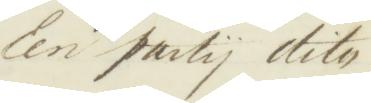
Een partij dito
